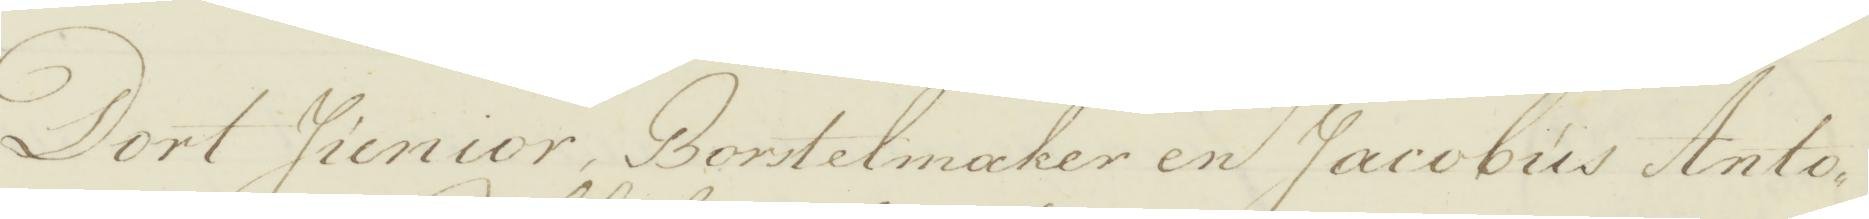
Dort Junior, Borstelmaker en Jacobus Anto„
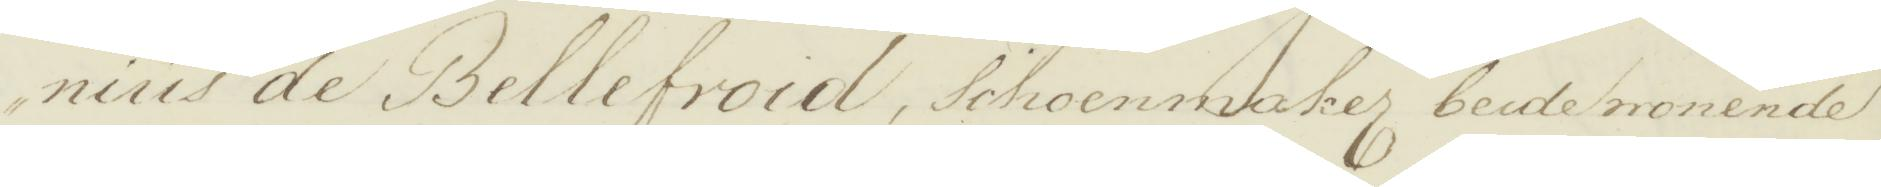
„nius de Bellefroid, schoenmaker, beide wonende
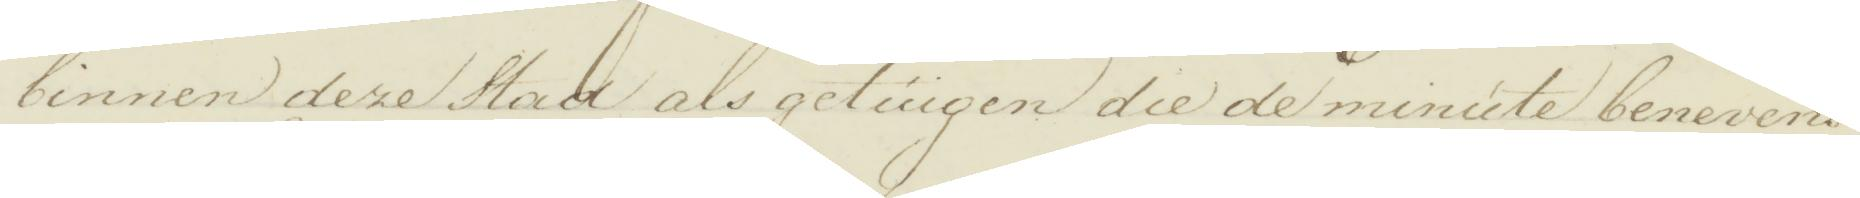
binnen deze stad als getuigen die de minute benevens
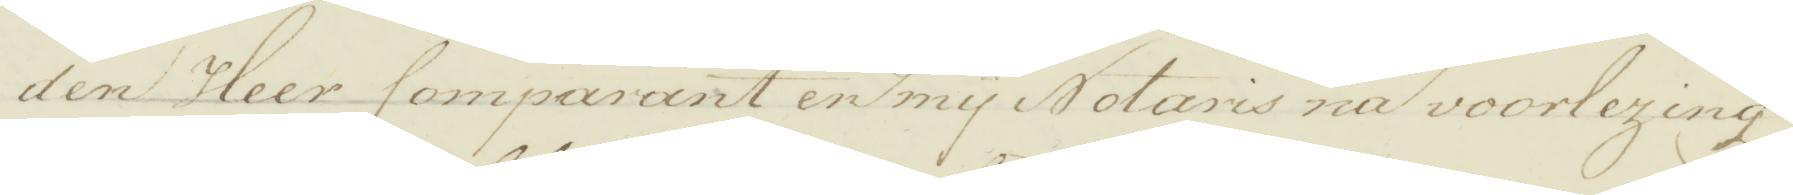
den Heer Comparant en mij Notaris na voorlezing
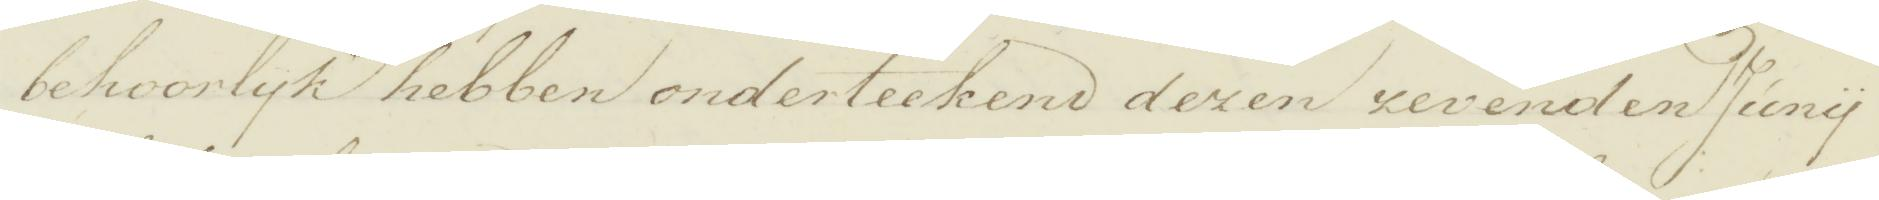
behoorlijk hebben onderteekend dezen zevenden Junij
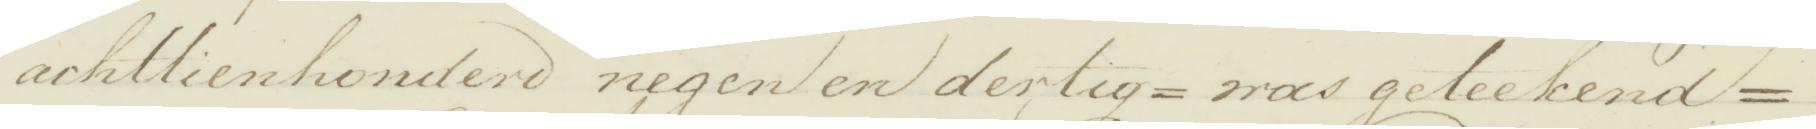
achttienhonderd negen en dertig = was geteekend=
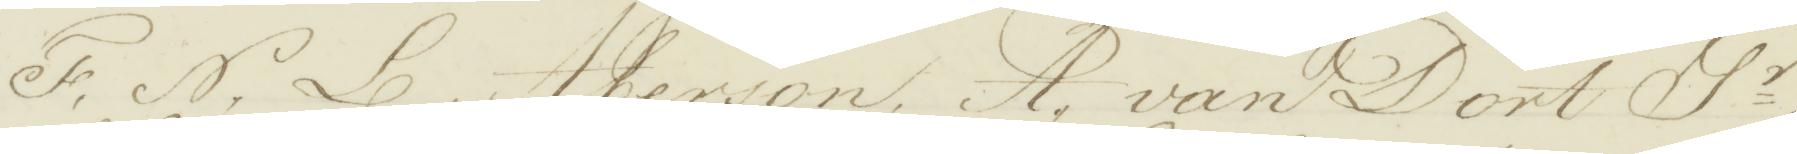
F, N, L, Aberson, A„ van Dort I=r
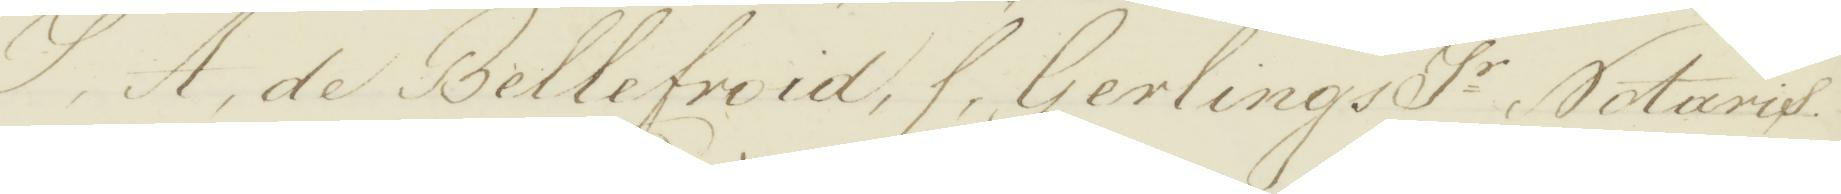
I, A, de Bellefroid, C, Gerlings I=r Notaris.
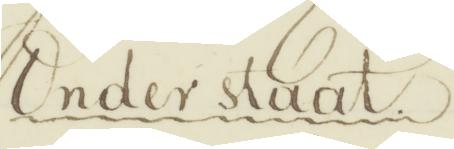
Onder staat.
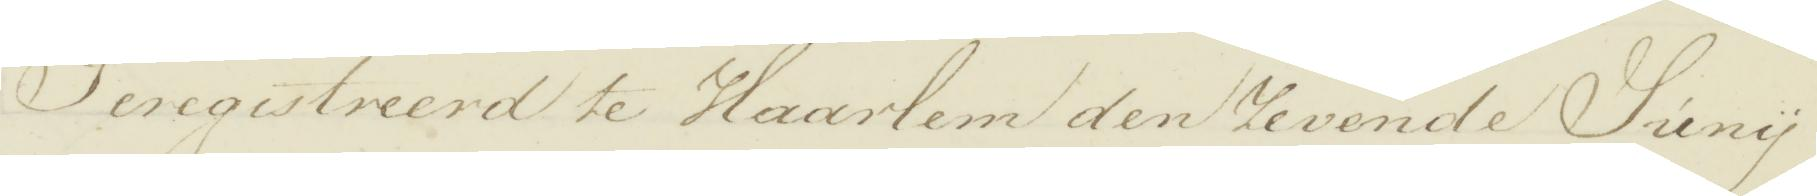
Geregistreerd te Haarlem den zevende Iunij
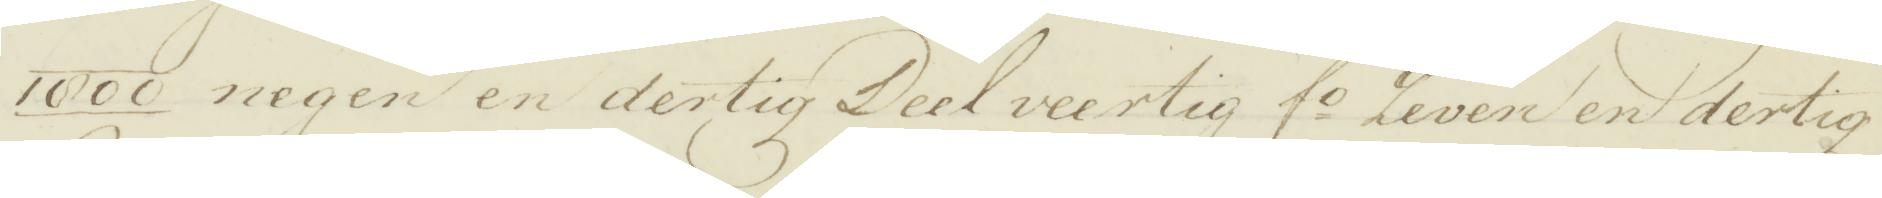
1800 negen en dertig Deel veertig f=o zeven en dertig
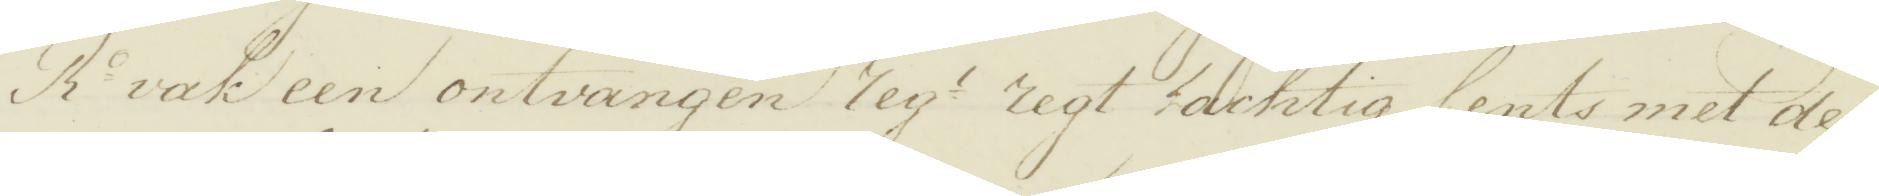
R=o vak een ontvangen reg=t regt tachtig Cents met de
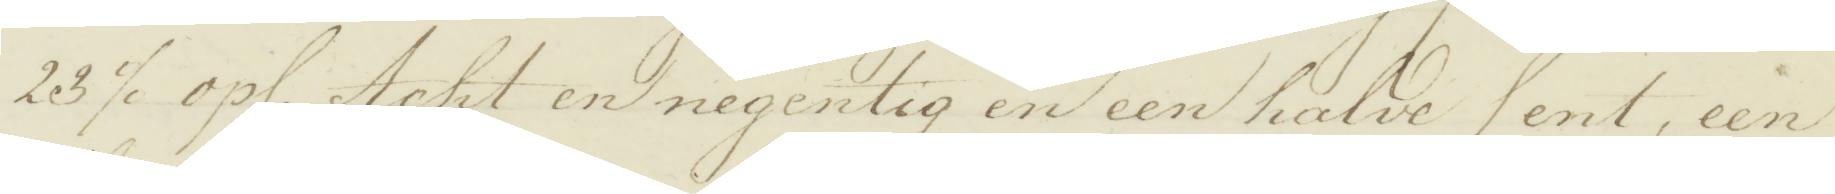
23% opC. Acht en negentig en een halve Cent, een
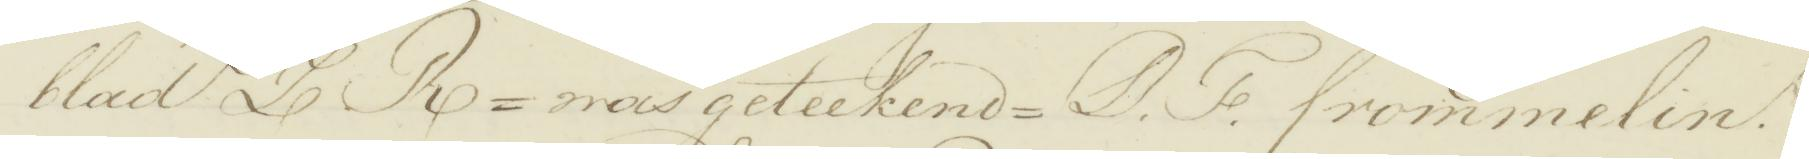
blad Z R = was geteekend = D. F. Crommelin.
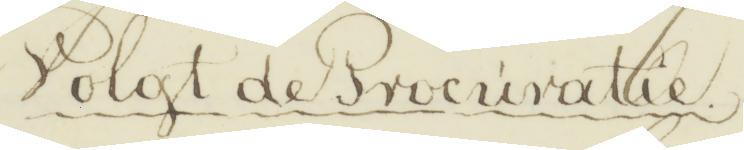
Volgt de Procuratie.
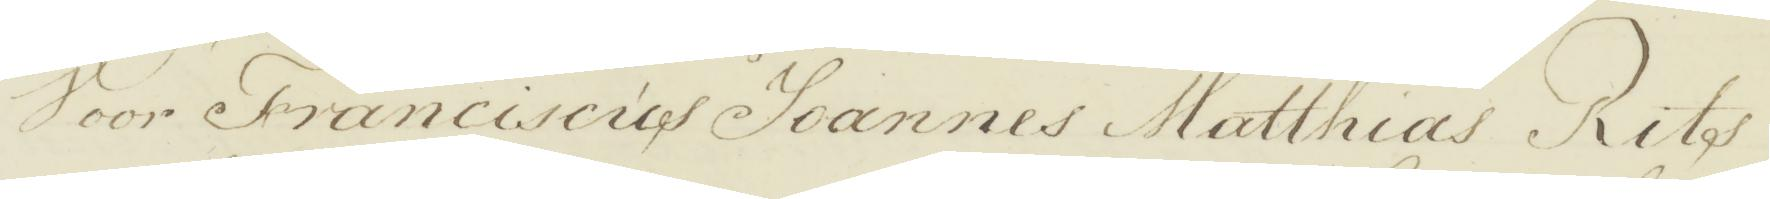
Voor Franciscus Ioannes Matthias Rits
